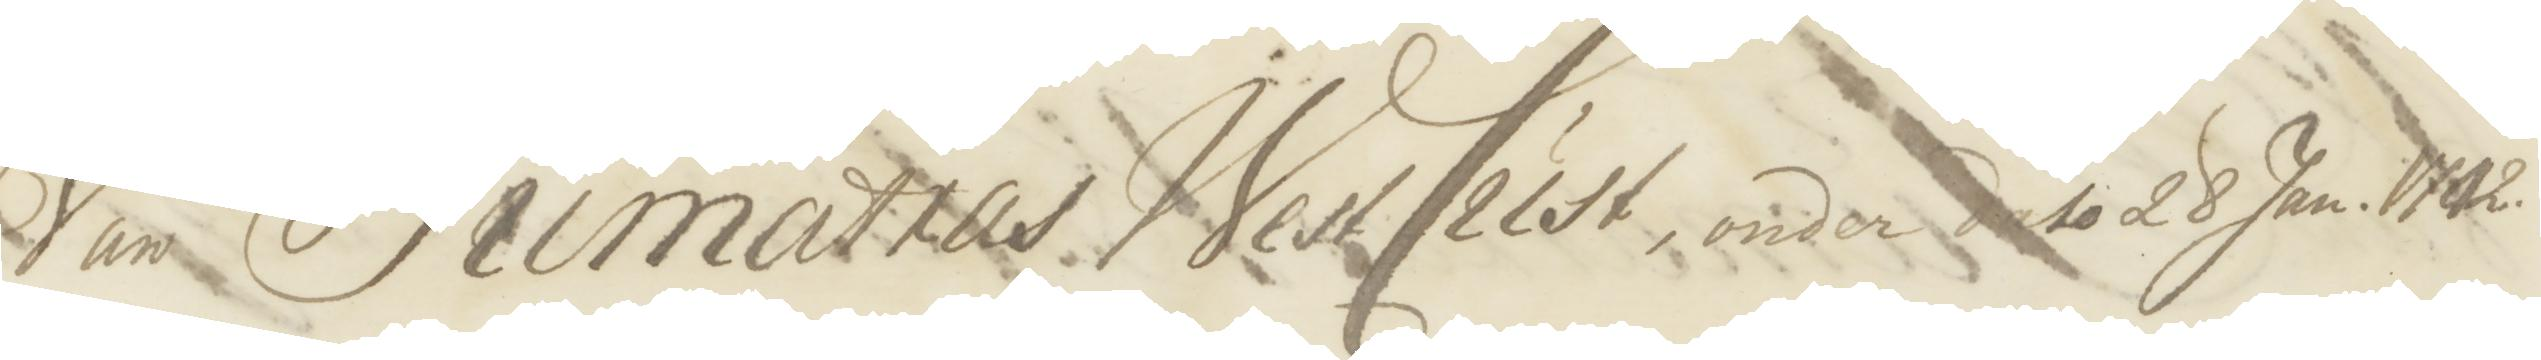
Van Sumatras West Cust, onder dato 28 Jan. 1742.
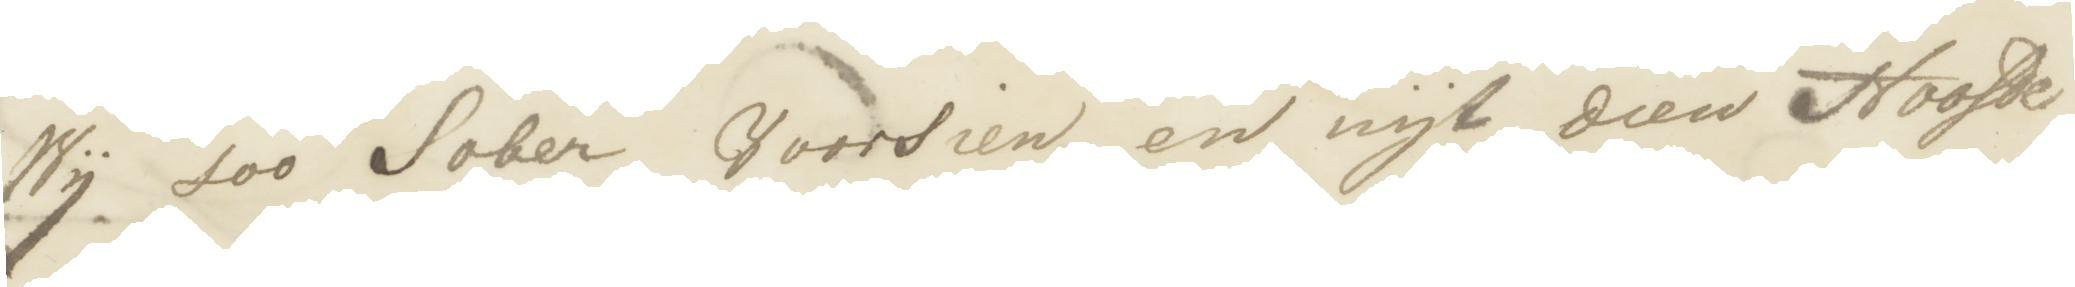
Wij soo sober voorsien, en uijt dien Hoofde
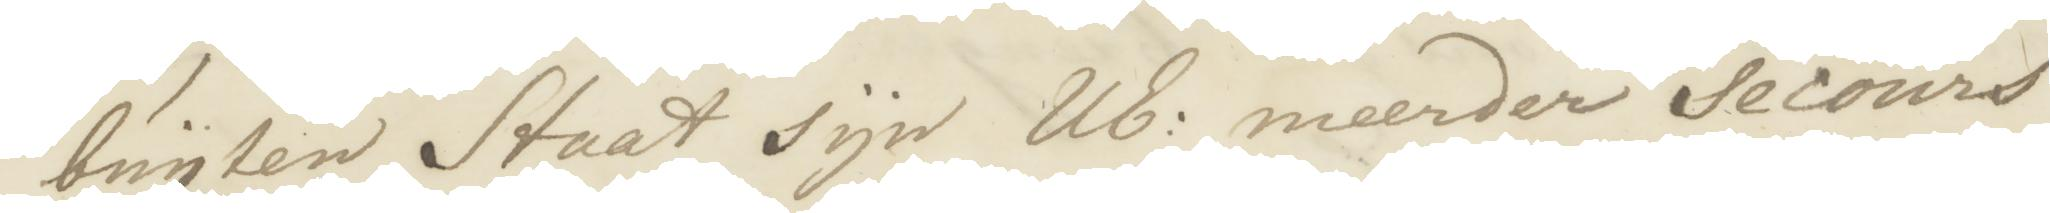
buijten staat sijn UE: meerder secours
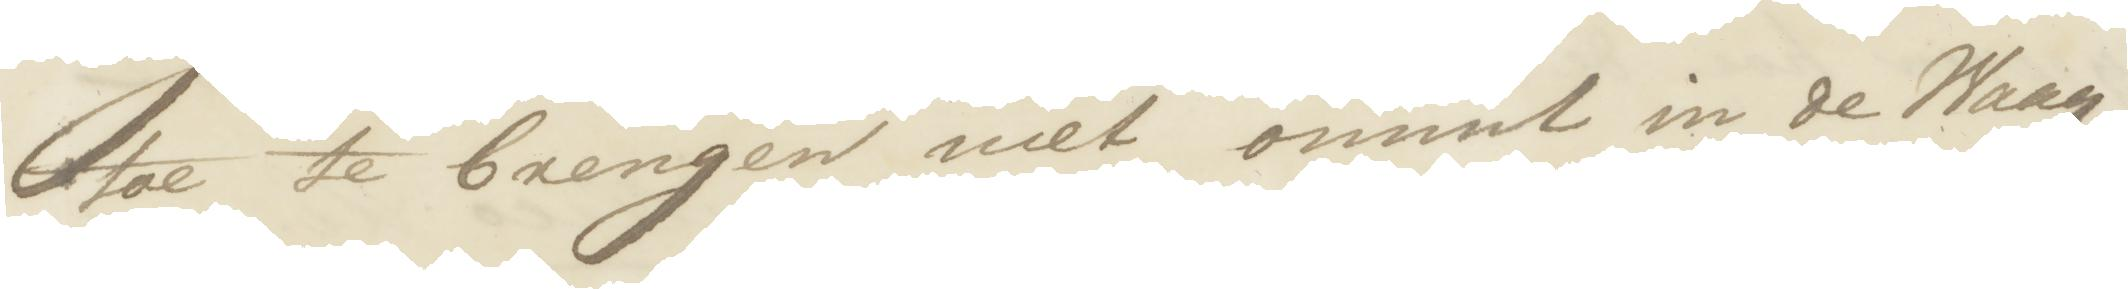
toe te brengen niet onnut in de Waag
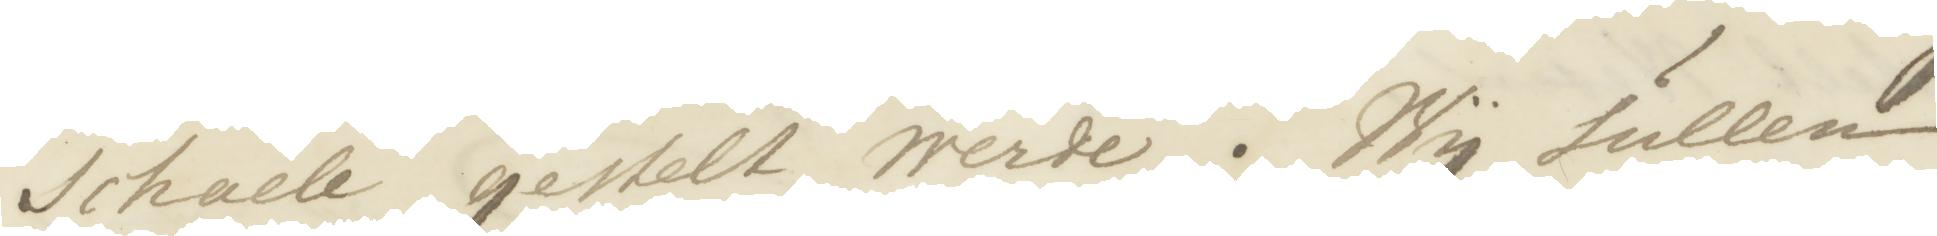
schaele gestelt werde. Wij sullen
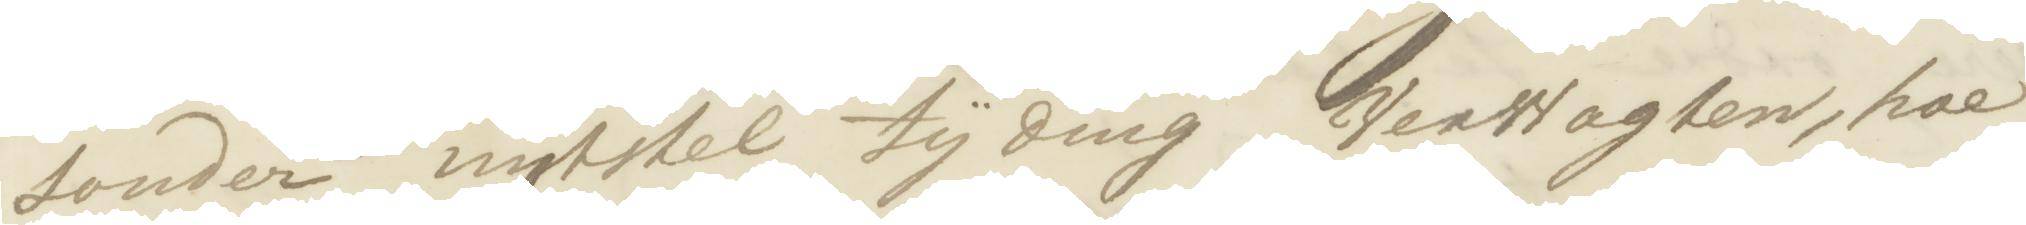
sonder uijtstel tijding verwagten, hoe
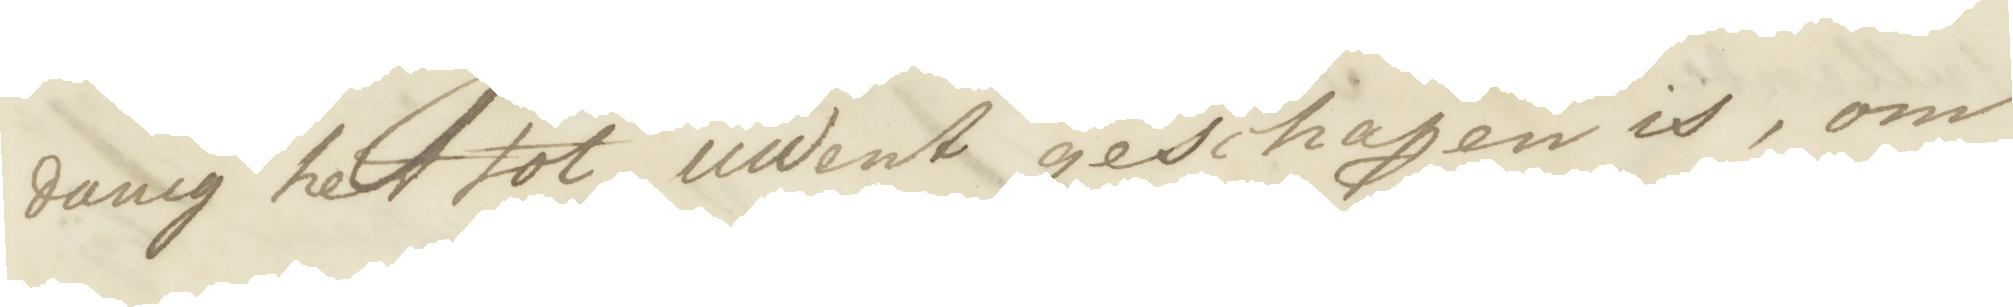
danig het tot uwent geschapen is, om
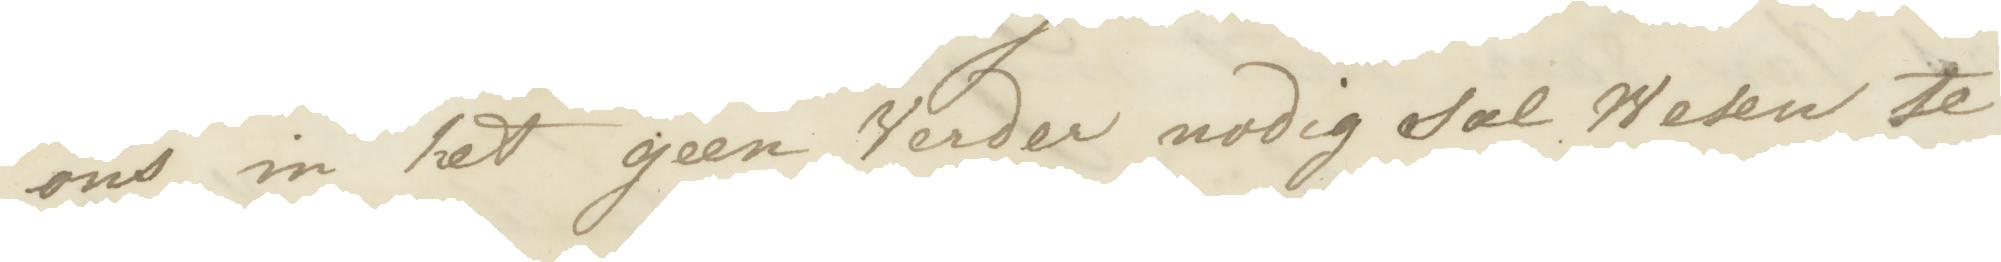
ons in het geen verder nodig sal wesen te
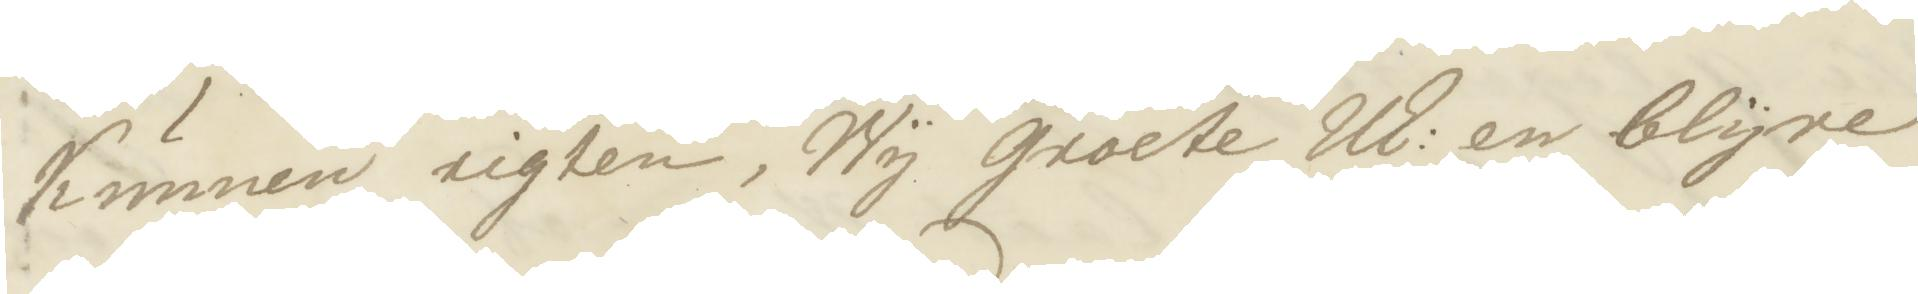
kunnen rigten, Wij groete UE: en blijve
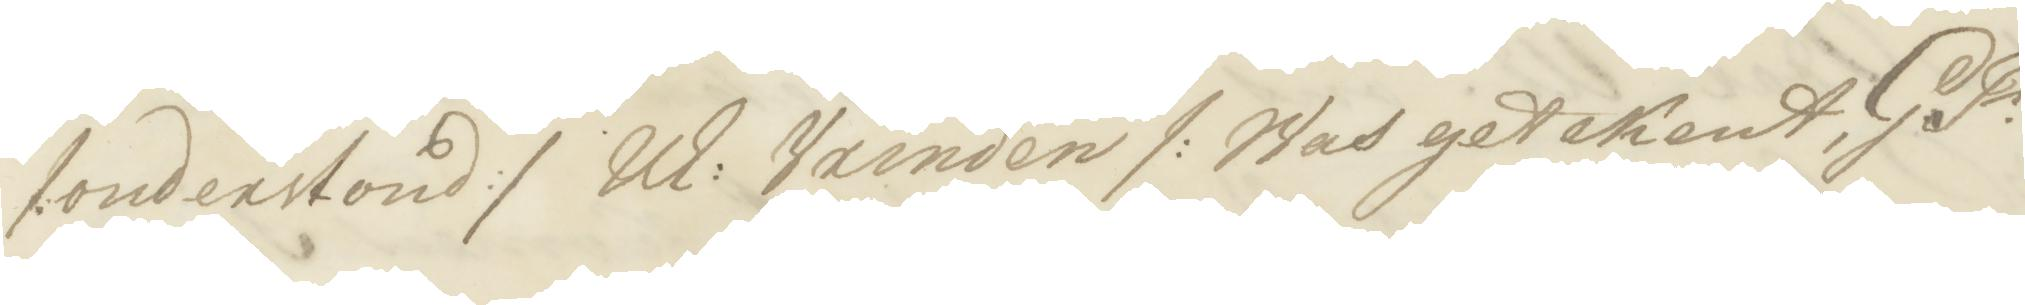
/: onderstond :/ UE. Vrinden /: was getekent, G. F.
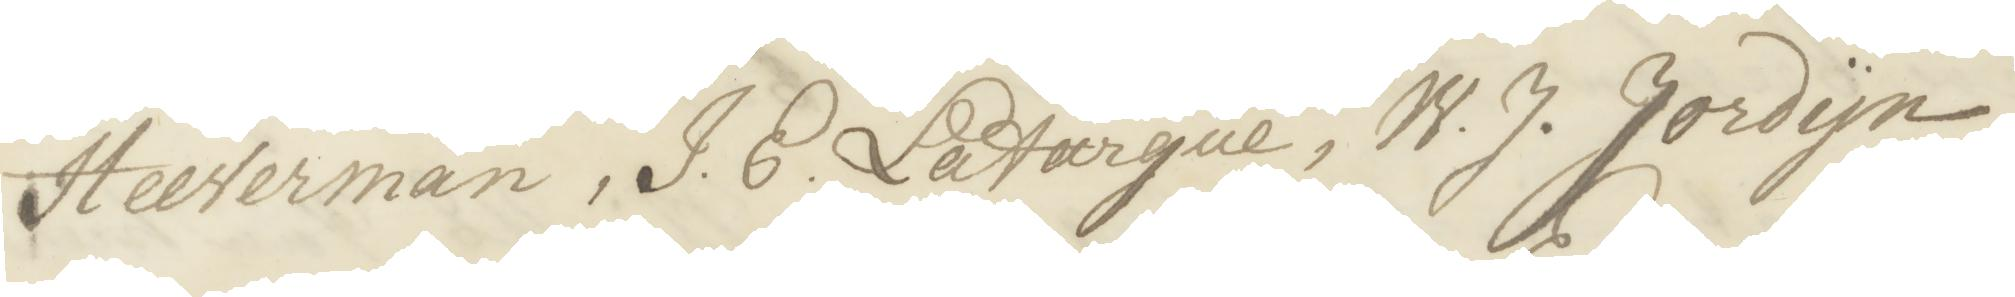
Heeverman, I. E. Latargue, W. J. Jordijn,
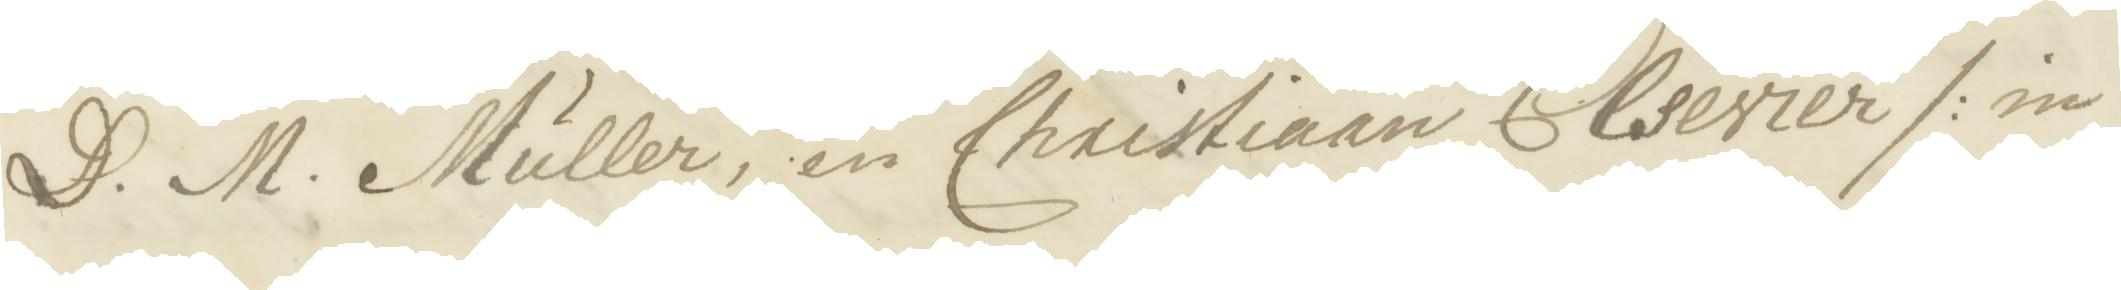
D. M. Muller, en Christiaan Elsevier /: in
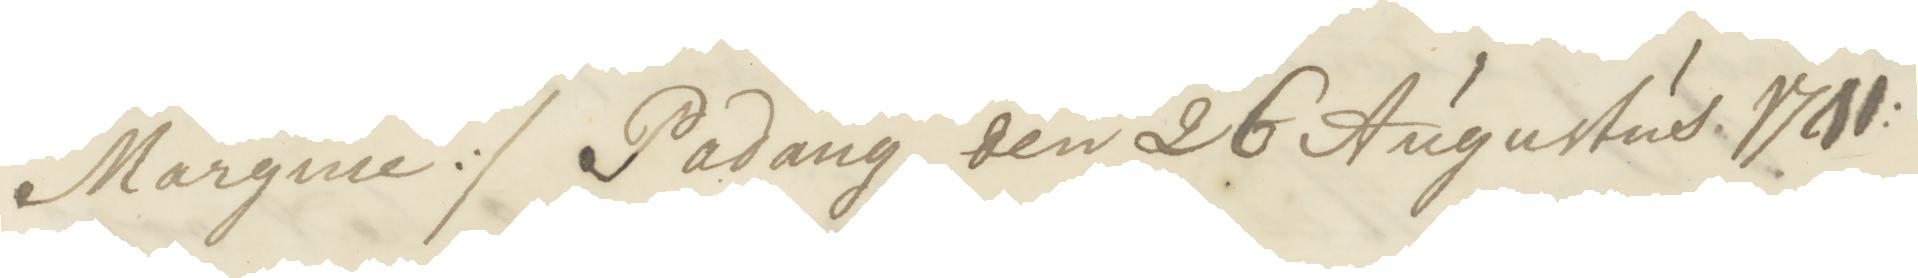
Margine :/ Padang den 26 Augustus 1741:
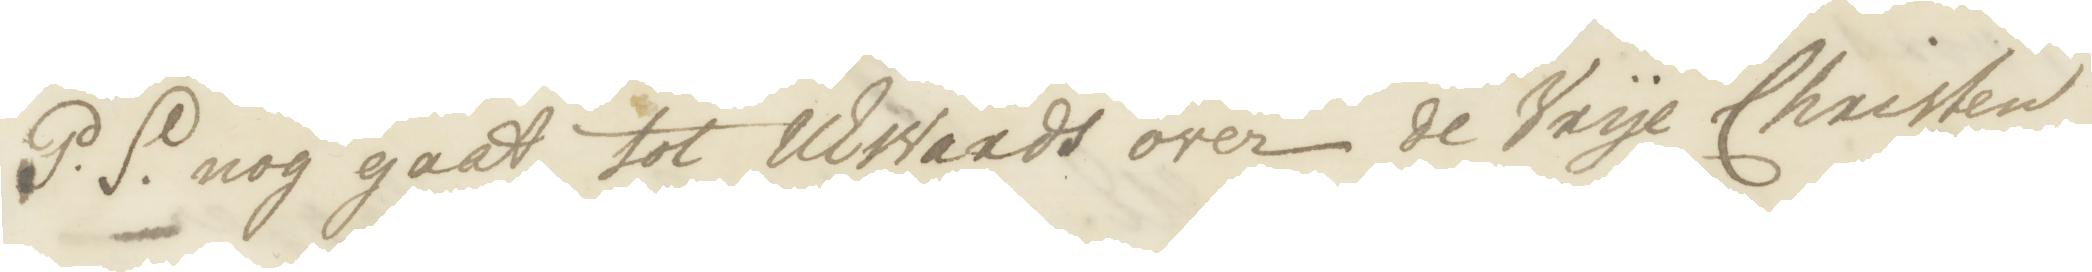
P. S. nog gaat tot UE wards over de Vrije Christen
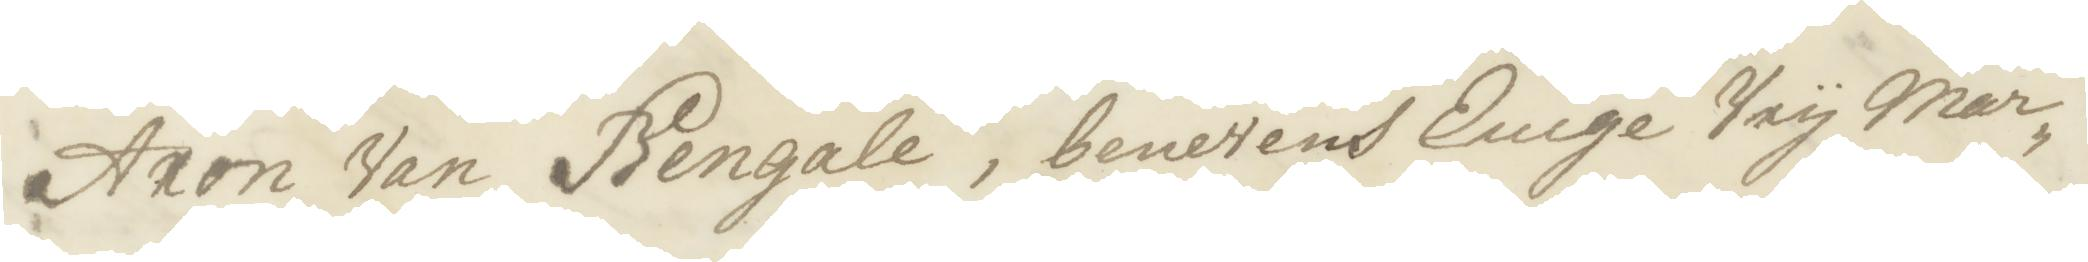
Aron van Bengale, benevens Enige vrij mar„
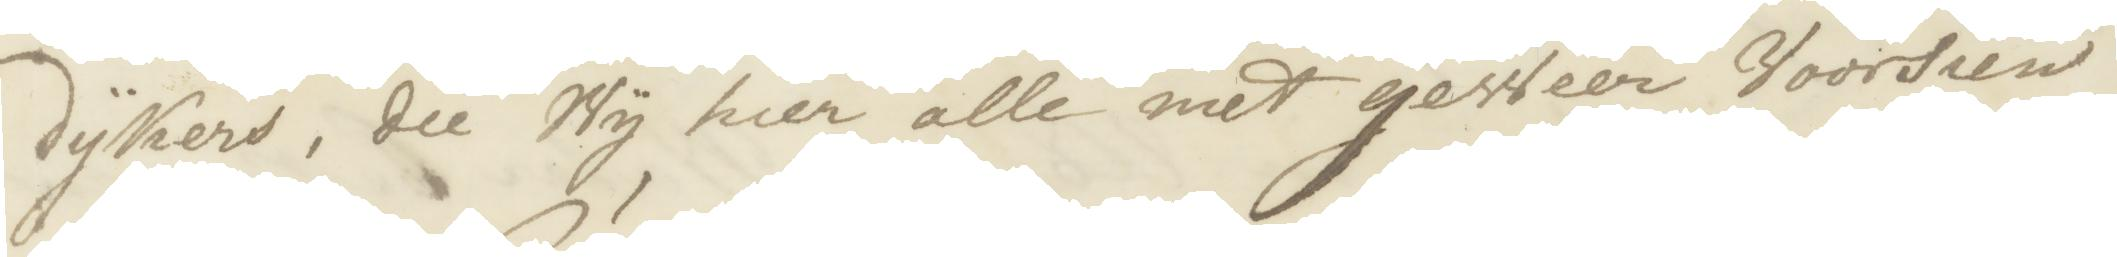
dijkers, die wij hier alle met geweer voorsien
